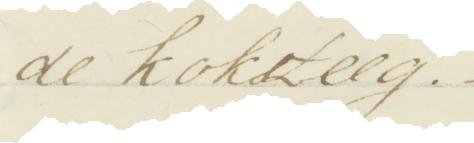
de koksteeg.
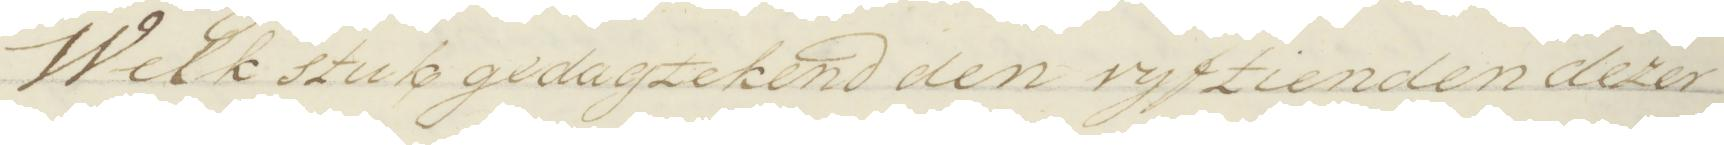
Welk stuk gedagtekend den vyftienden dezer
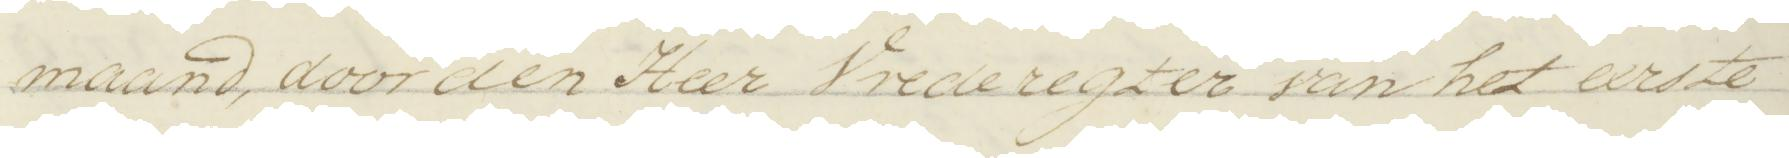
maand, door den Heer Vrederegter van het eerste
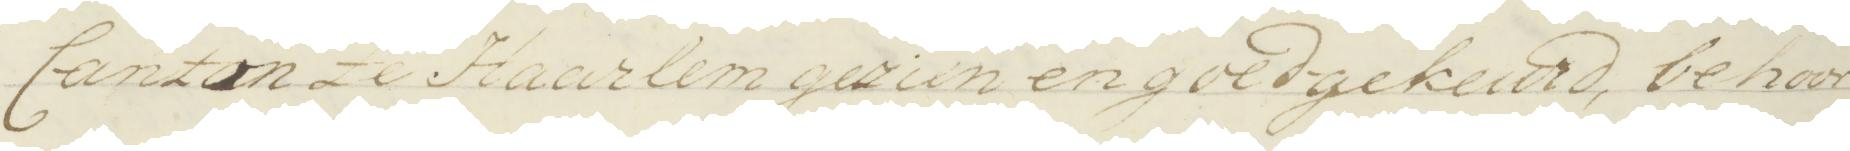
Canton te Haarlem gezien en goedgekeurd, behoor
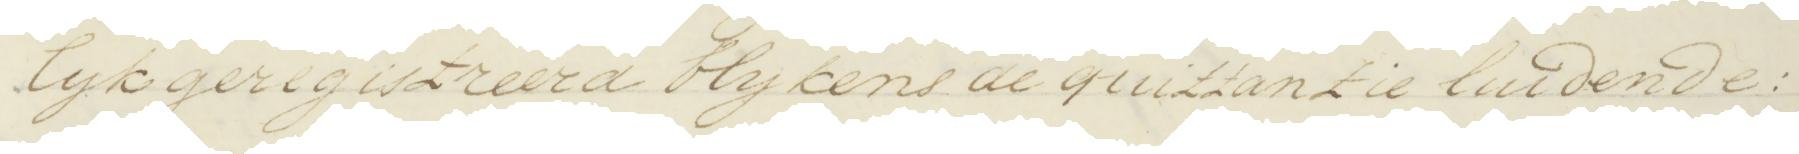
lyk geregistreerd blykens de quittantie luidende:
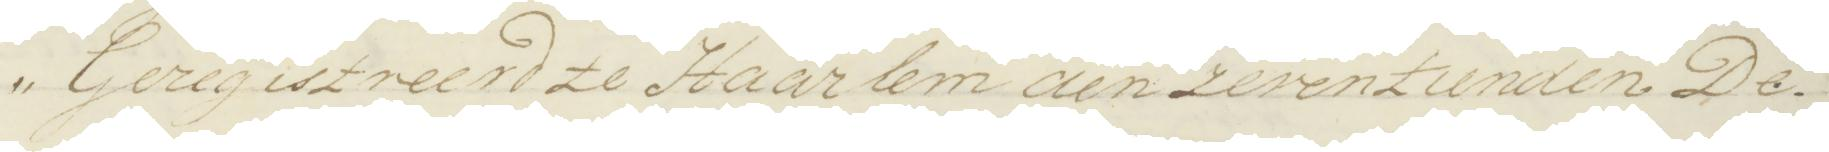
„ Geregistreerd te Haarlem den zeventienden De-
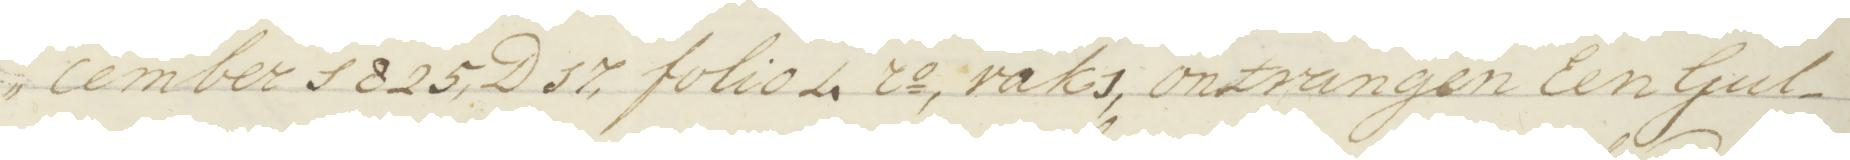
„ cember 1825, D17, folio 4 r=o, vak 1, ontvangen een Gul-
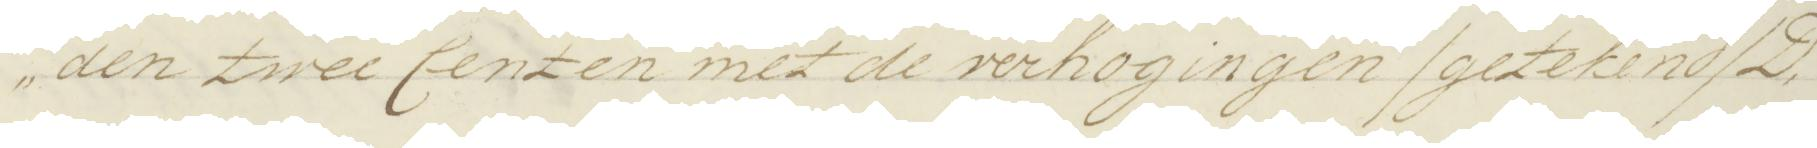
„ den twee Centen met de verhogingen /getekend/ D,
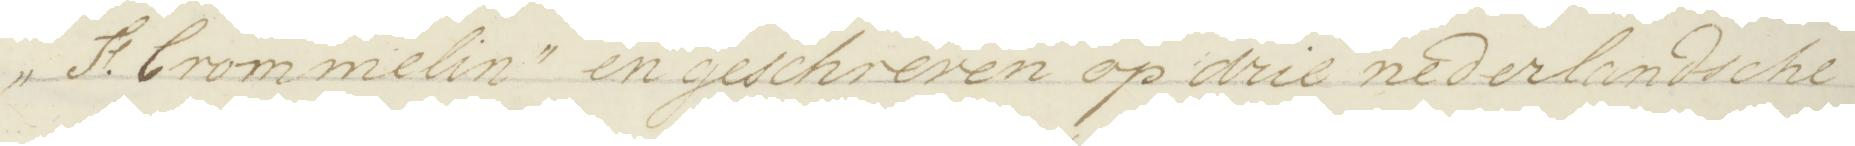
„ F. Crommelin" en geschreven op drie nederlandsche
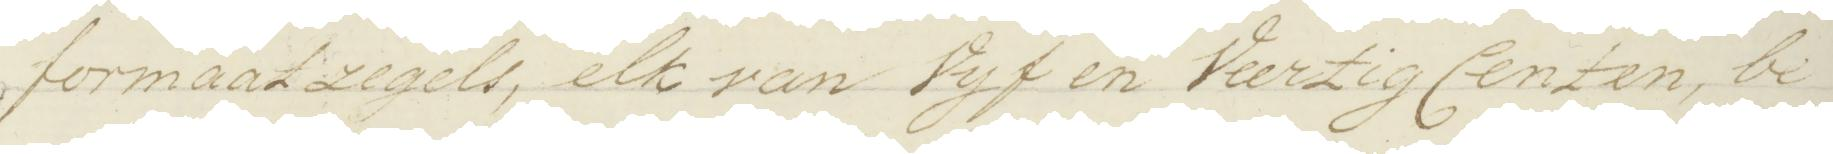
„ formaat zegels, elk van Vyf en Veertig Centen, be
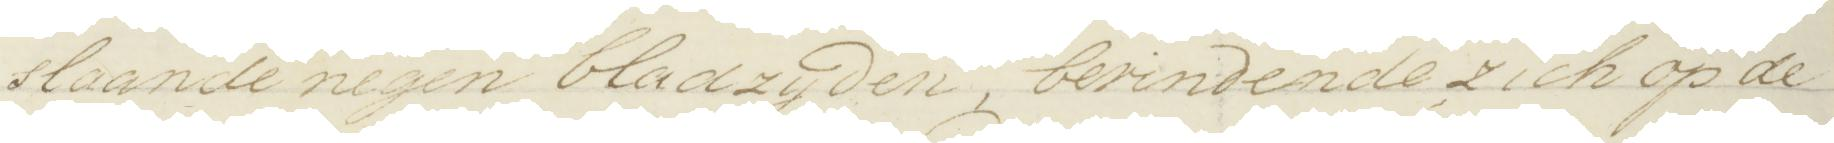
slaande negen bladzijden, bevindende zich op de
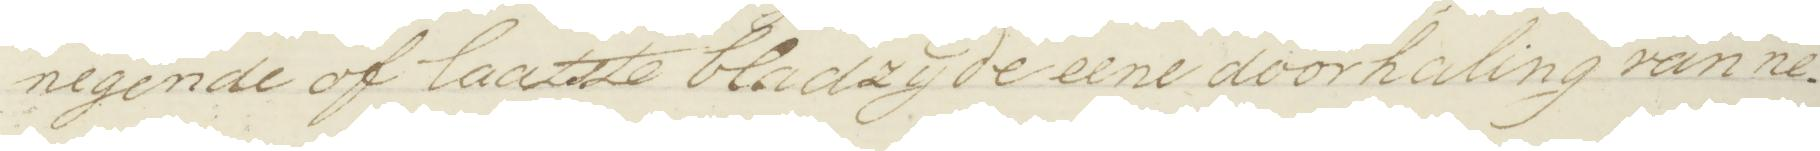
negende of laatste bladzyde eene doorhaling van ne
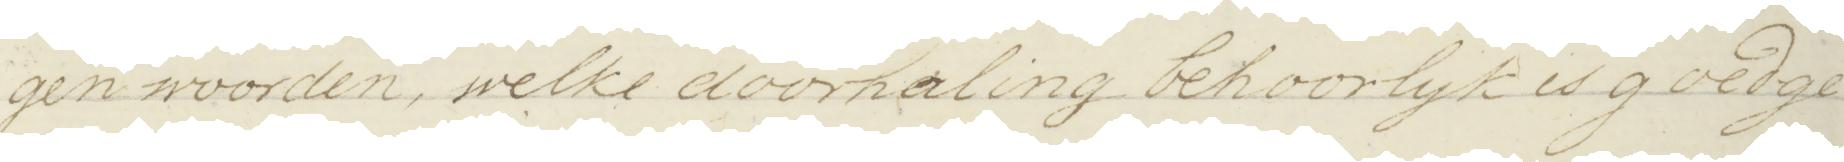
gen woorden, welke doorhaling behoorlyk is goedge
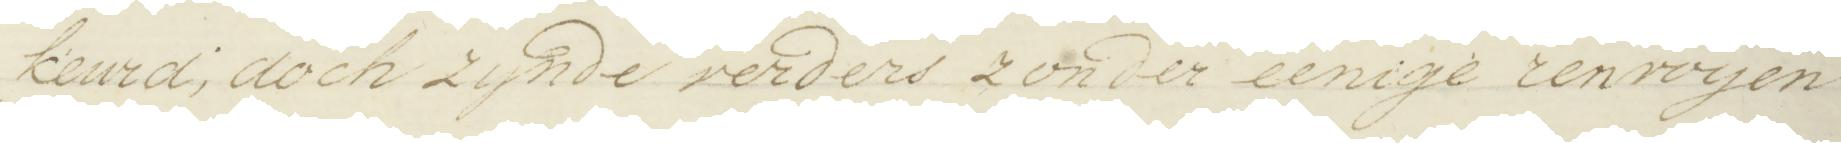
keurd, doch zynde verders zonder eenige renvoyen
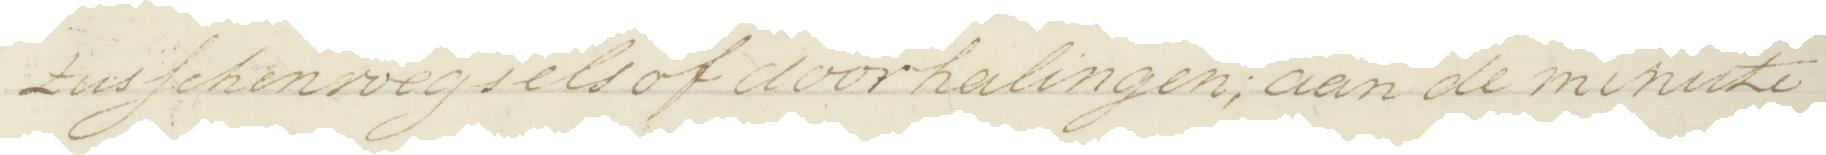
tusschenvoegsels of doorhalingen; aan de minute
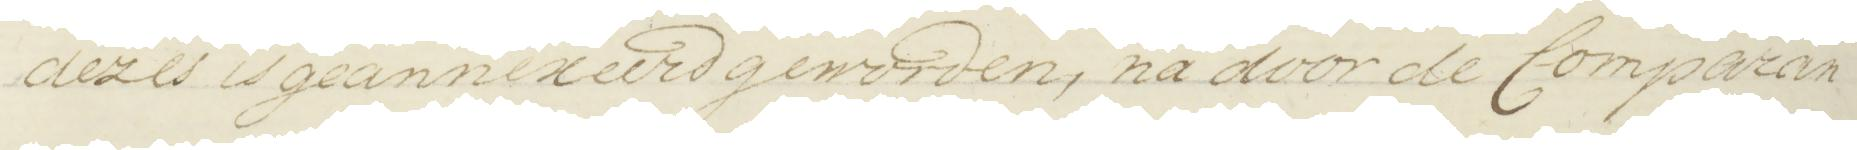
dezes is geannexeerd geworden, na door de Comparan
